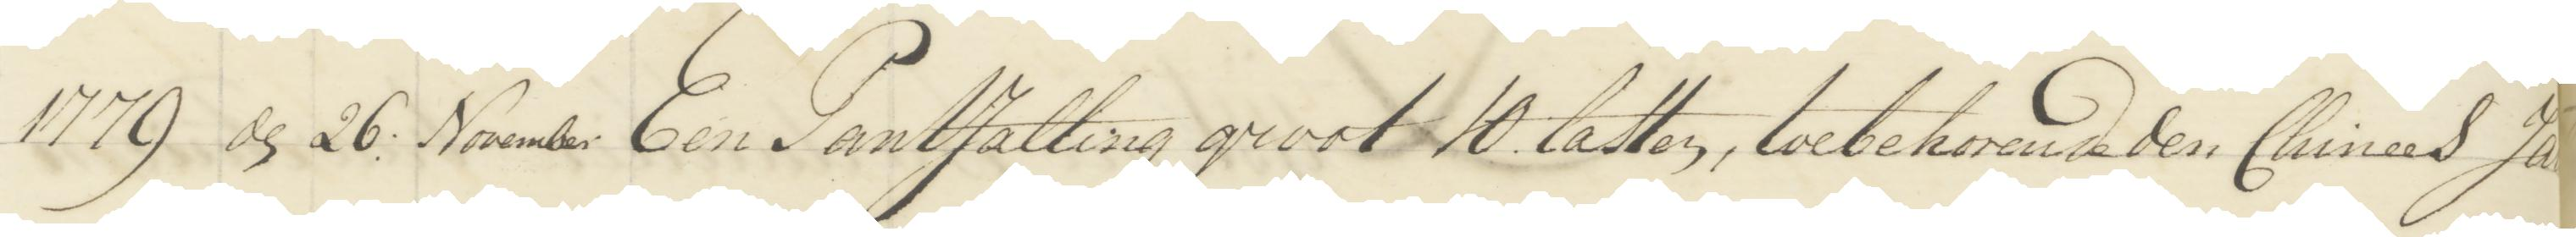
1779 den 26: November Een Pantjalling groot 10 lasten, toebehorende den Chinees Ja
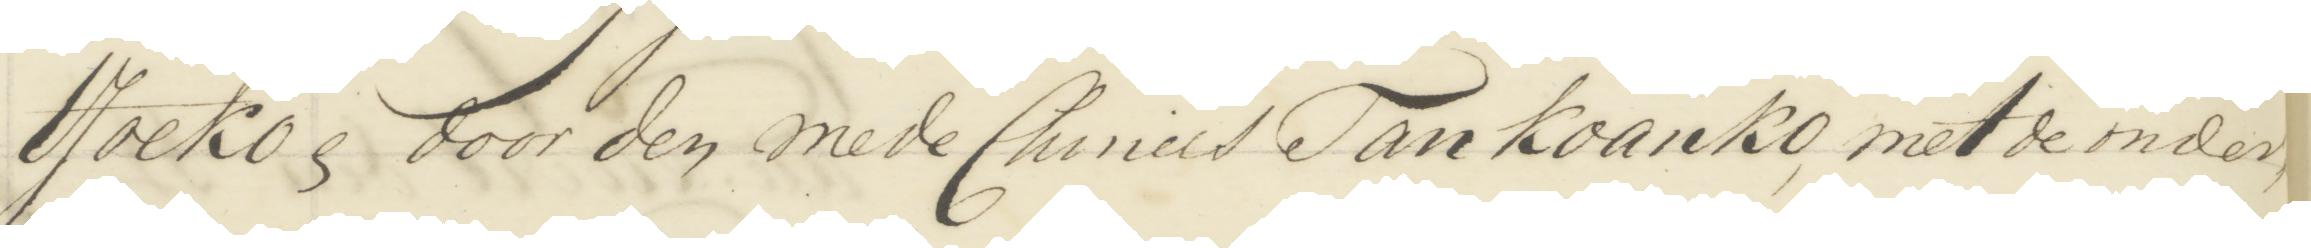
tJoeko en door den mede Chinees Tankoanko, met de onder
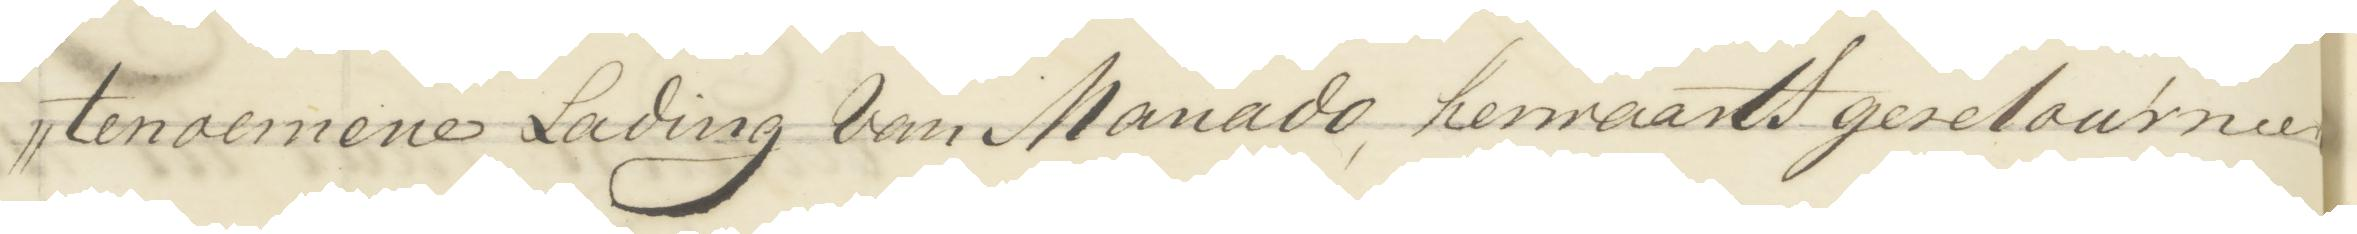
„te noemene Lading van Manado, herwaarts geretourneer
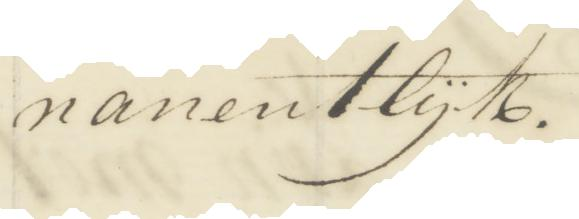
nanentlijk.
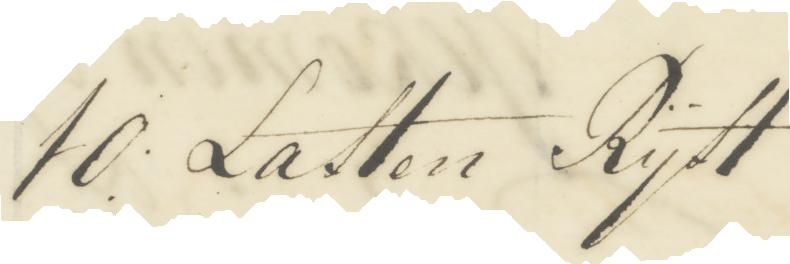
10: Lasten Rijst
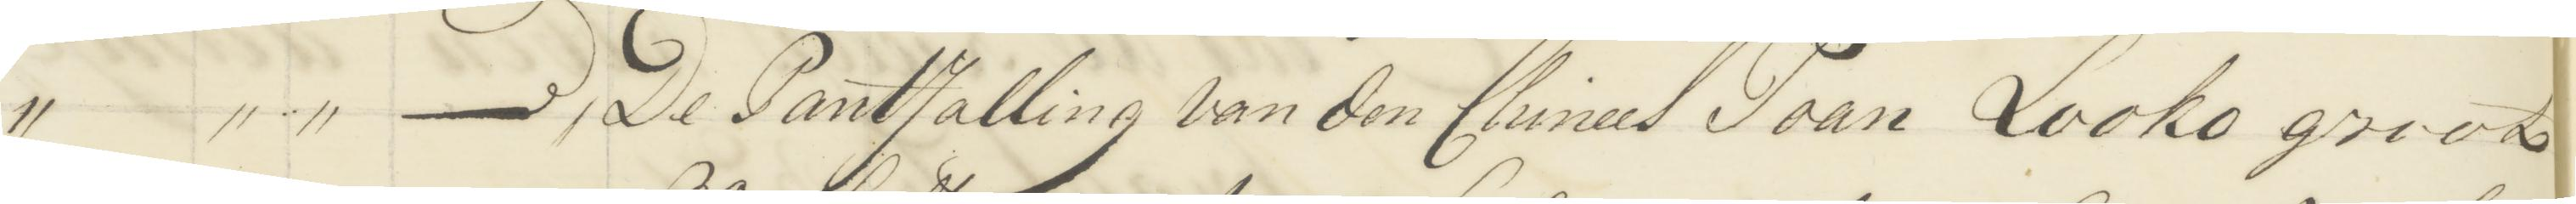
„ „ „ —: ', De Pantjalling van den Chinees Poan Looko groot
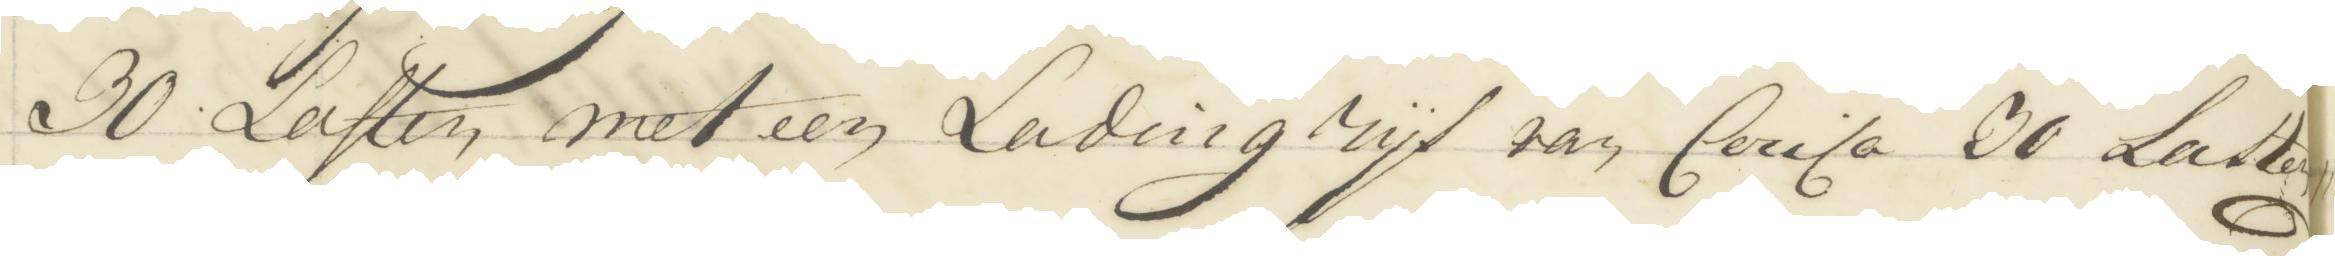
30: Lasten met een Lading rijs van Cerica 30 Lasten
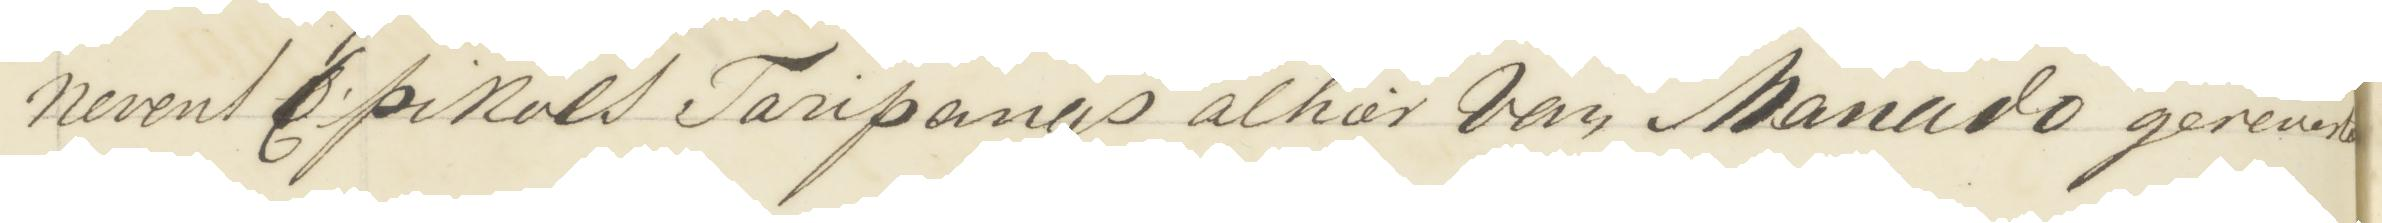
nevens 6 pikols Taripangs alhier van Manado gerever
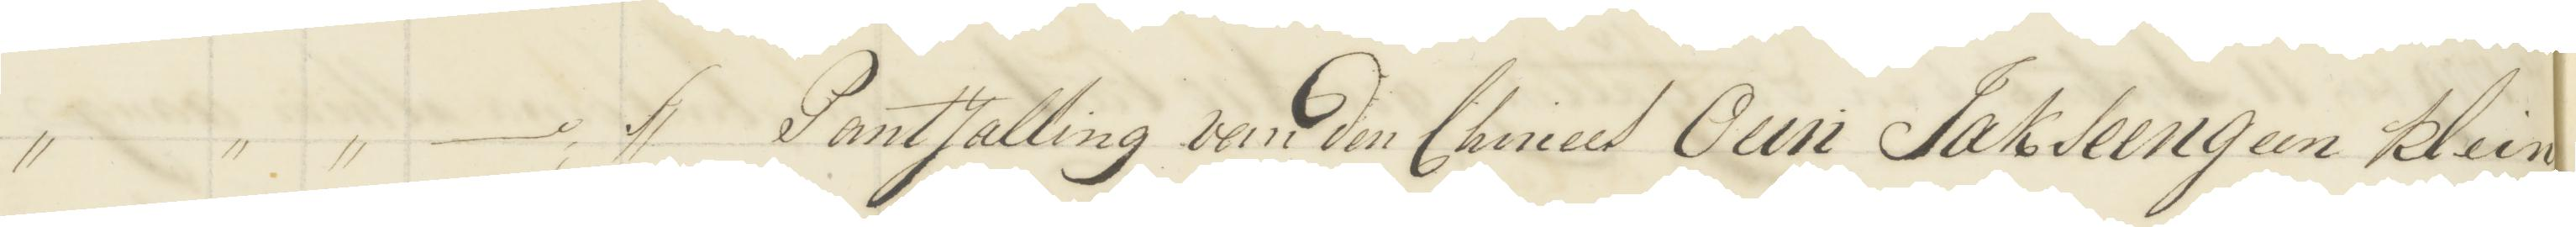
„ „ „ —:o „ Pantjalling van den Chineees Oun Tak Seeng een klein
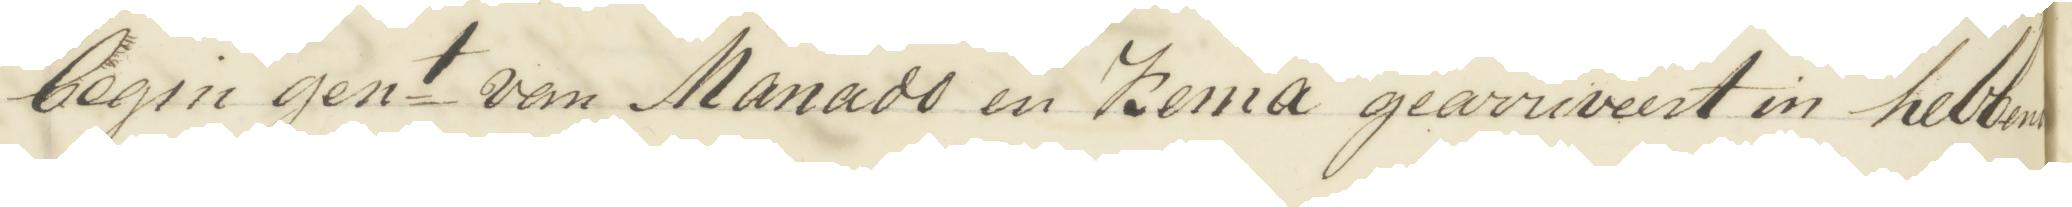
begin gen=t van Manado en Kema gearriveert in hebben
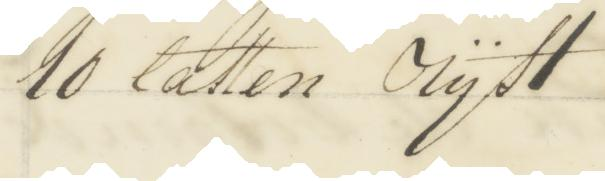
10 lasten rijst
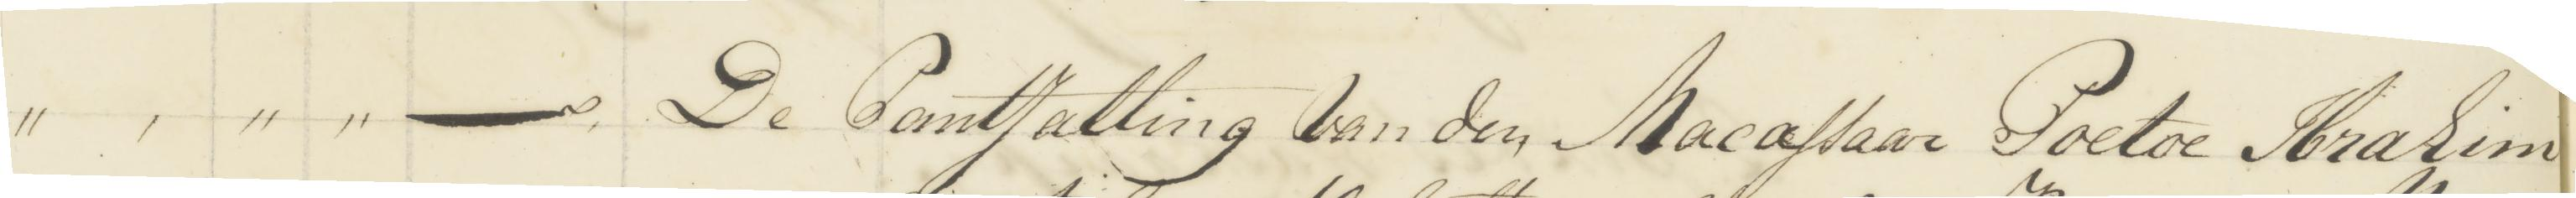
„ „ „ „ —:' De Pantjalling van den Macassaar Poetoe Ibrahim
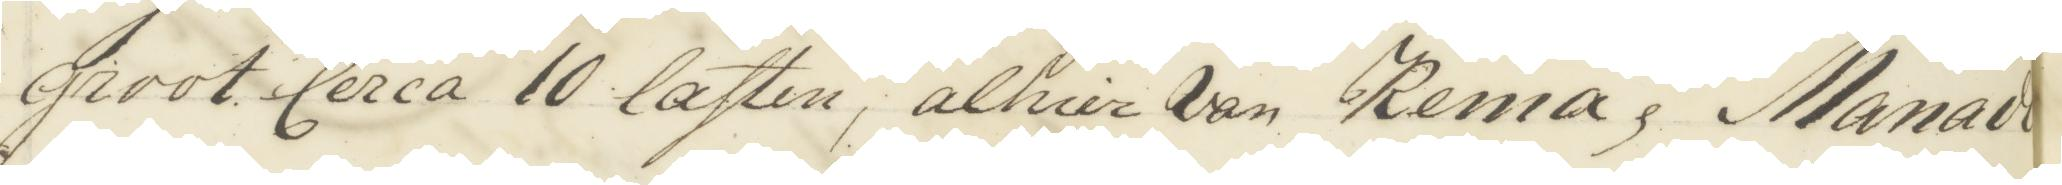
groot Cerca 10 lasten, alhier van Kemae n Manado
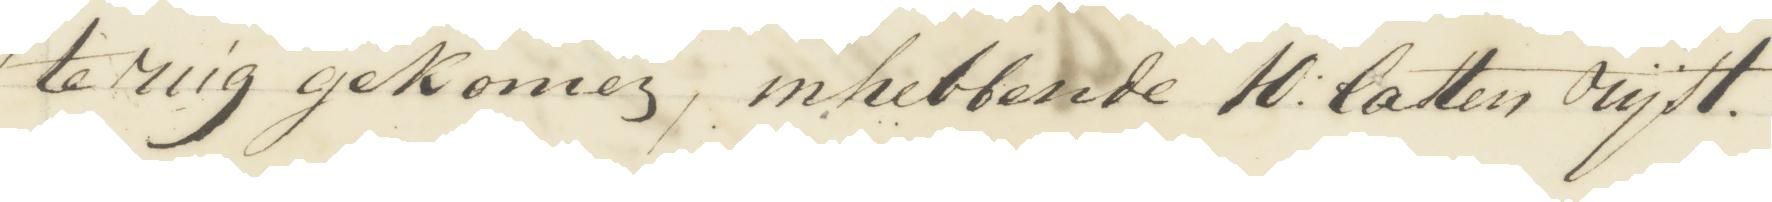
terug gekomen, inhebbende 10: lasten rijst.
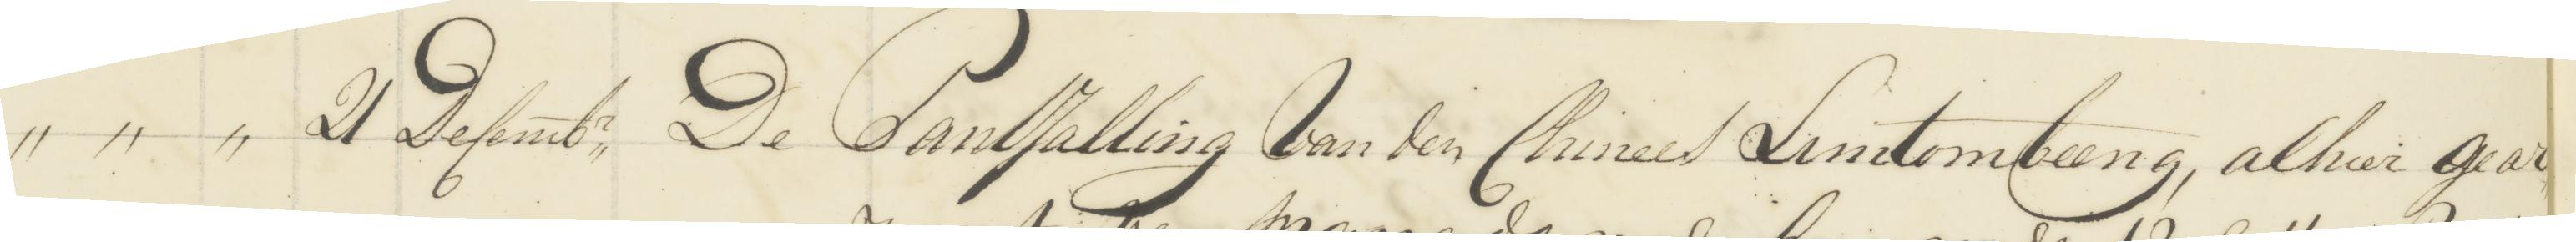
„ „ „ 21 Decemb„r De Pantjalling van den Chinees Limtombeeng, alhier gear
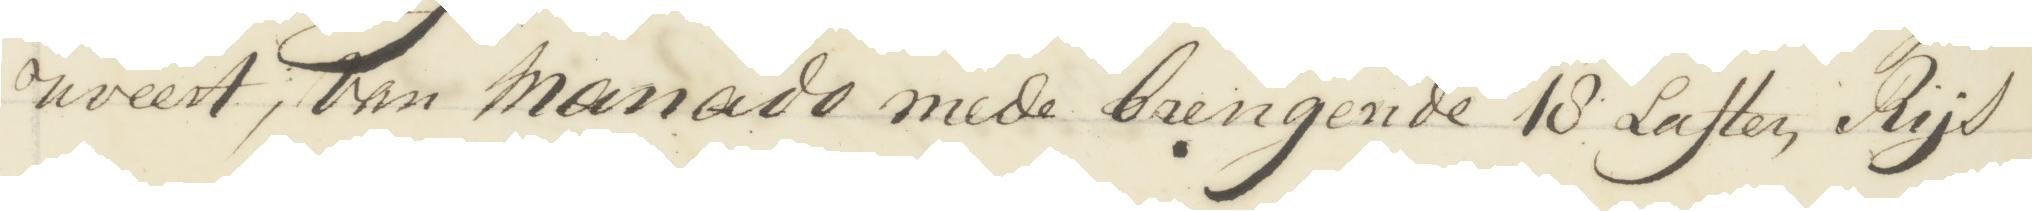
riveert, van Manado mede brengende 18 Lasten Rijs
